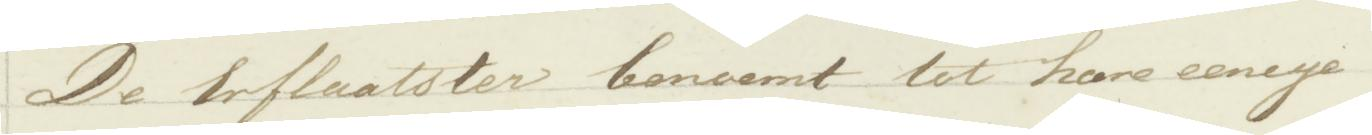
De Erflaatster benoemt tot hare eenige
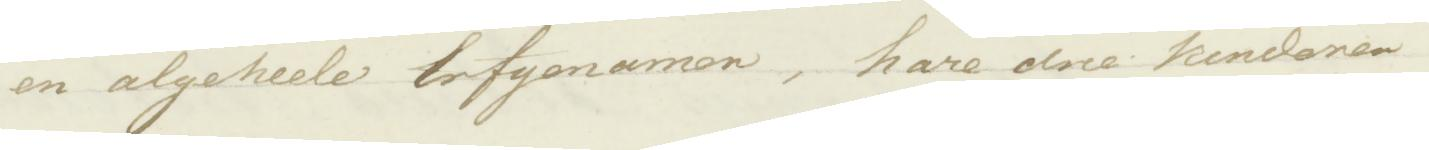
en algeheele Erfgenamen, hare drie kinderen
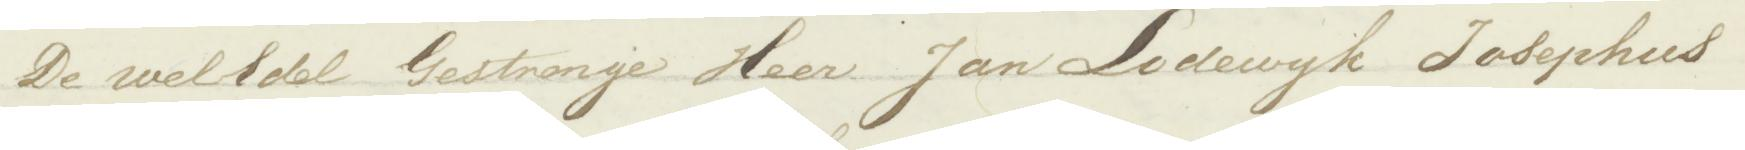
De welEdel Gestrenge Heer Jan Lodewyk Iosephus
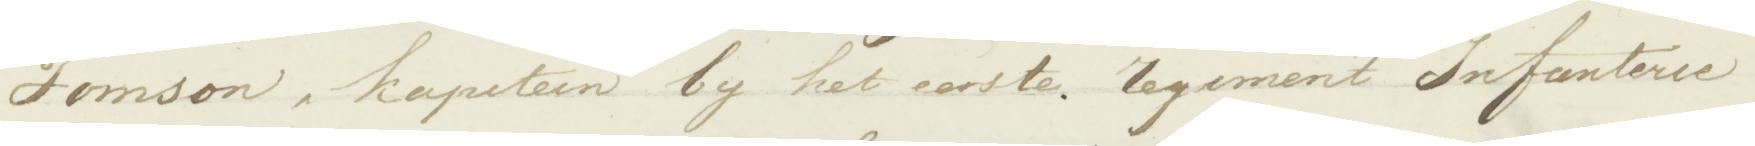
Tomson, kapitein bij het eerste regiment Infanterie
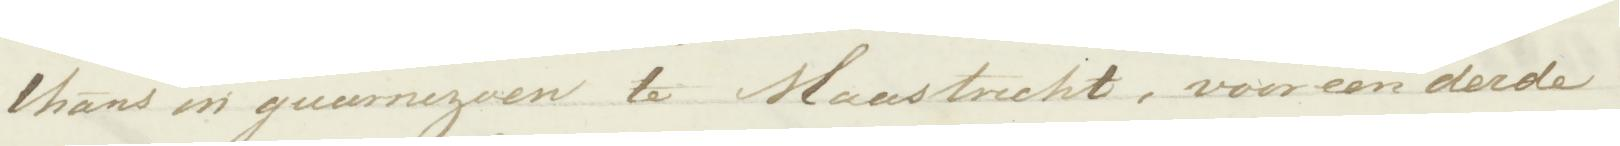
thans in guarnizoen te Maastricht, voor een derde
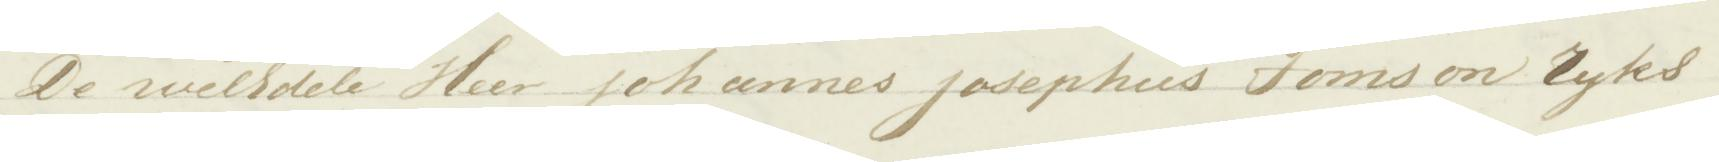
De welEdele Heer Johannes Josephus Tomson ryks
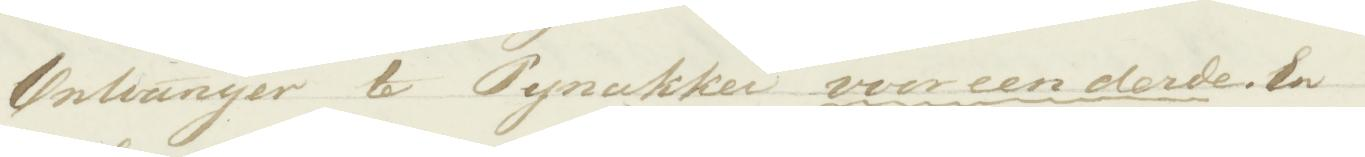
Ontvanger te Pynakker voor een derde. En
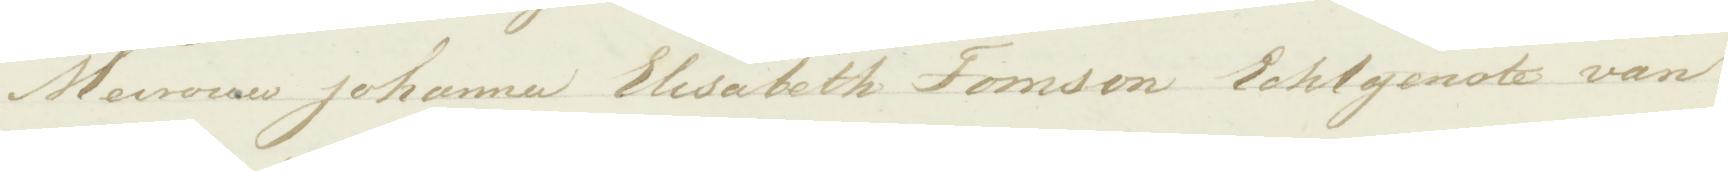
Mevrouw Johanna Elisabeth Tomson Echtgenote van
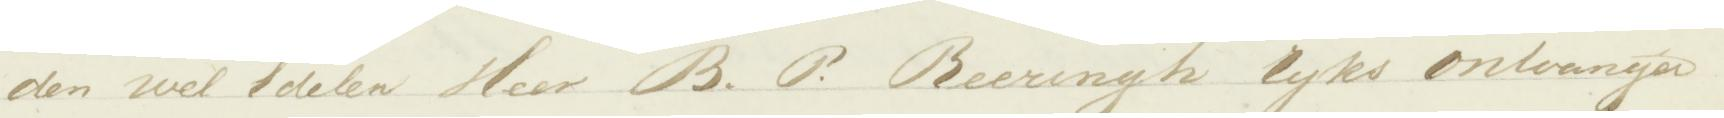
den wel Edelen Heer B. P. Reeringh ryks ontvangen
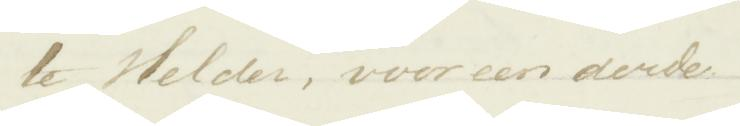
te Helder, voor een derde
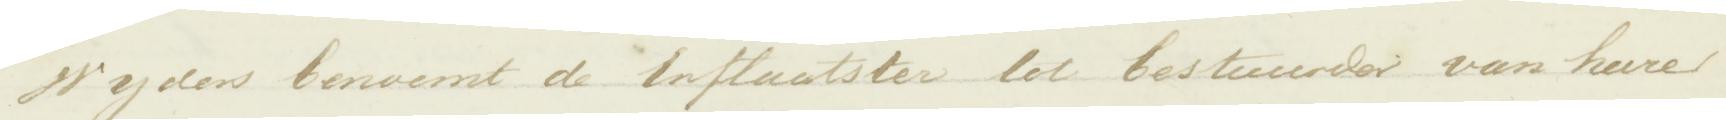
Wyders benoemt de Erflaatster tot bestuurder van hare
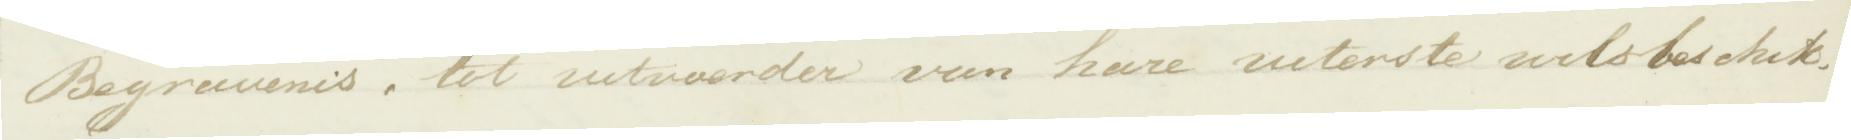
Begravenis, tot uitvoerder van hare uiterste wilsbeschik„
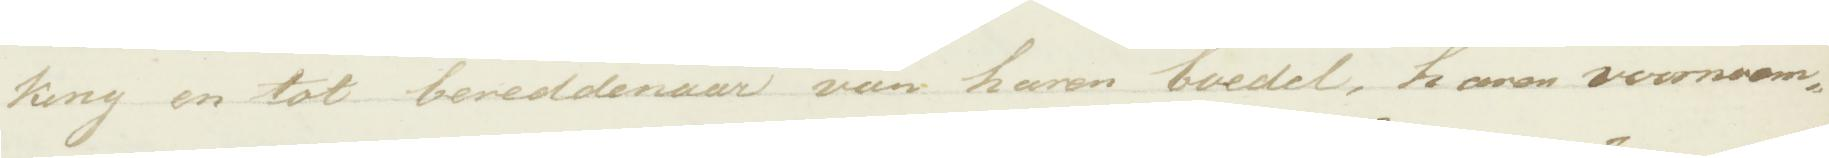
king en tot bereddenaar van haren boedel, haren voornoem„
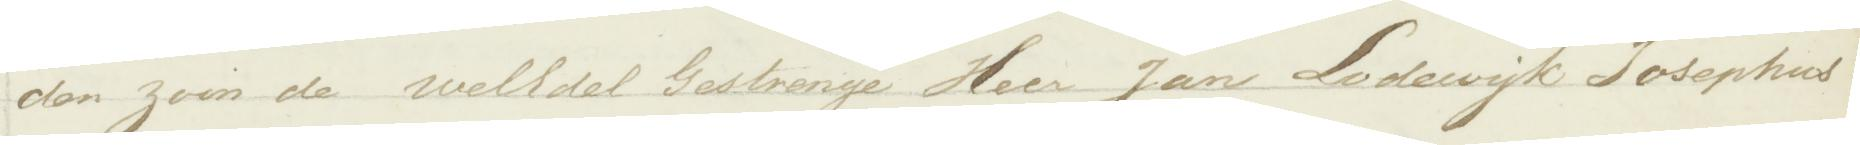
den zoon de welEdel Gestrenge Heer Jan Lodewijk Josephus
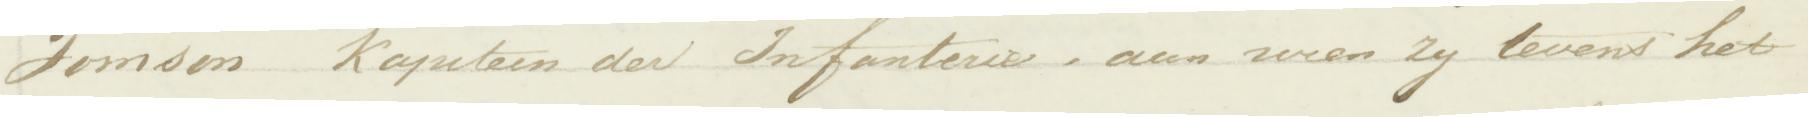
Tomson kapitein der Infanterie, aan wier zy tevens het
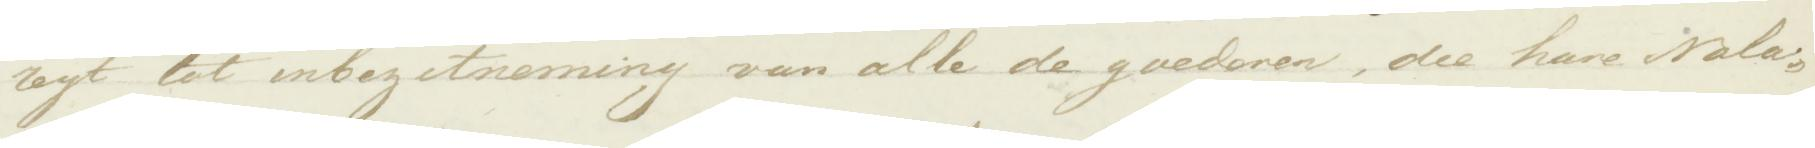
regt tot inbezitneming van alle de goederen, die hare Nala„
